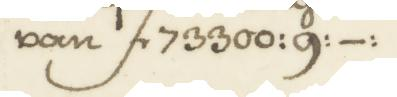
van ƒ 73300:9:–:
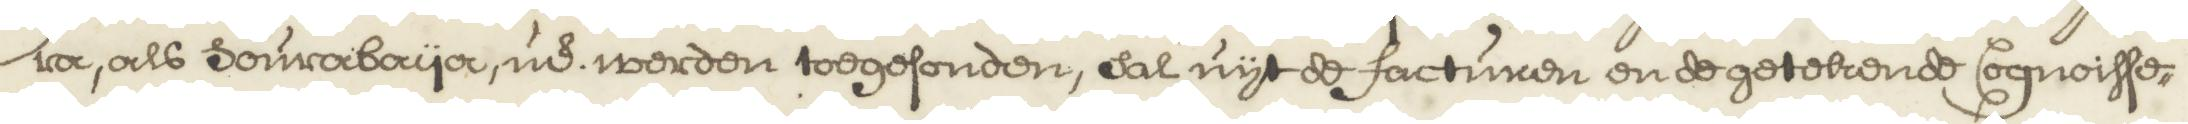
ra, als sourabaija, uE. werden toegesonden, sal uijt de facturen en de getekende Cognoisse„
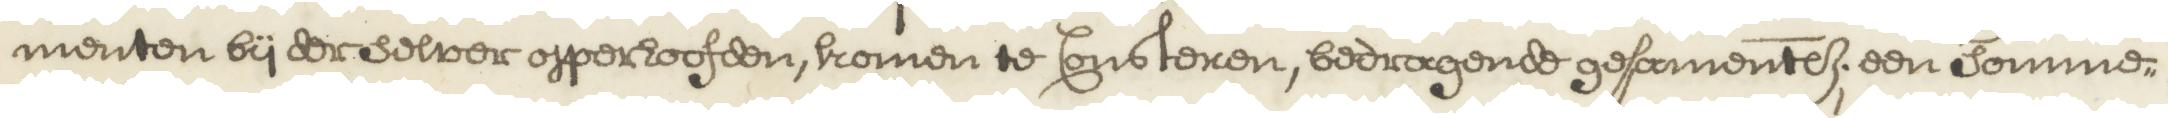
menten bij derselver opperhoofden, komen te Consteren, bedragende gesamentlijk een somme„
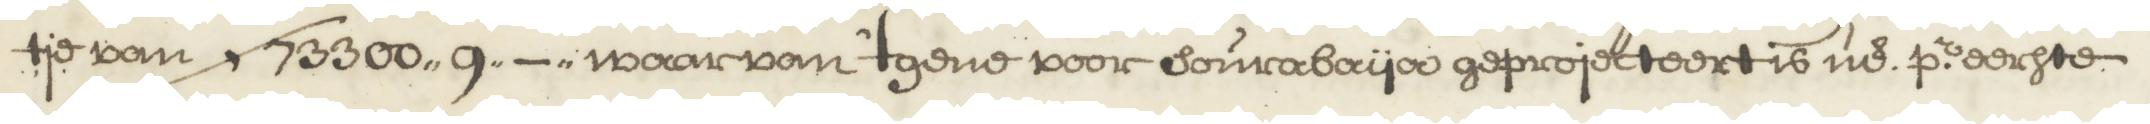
tje van ƒ 73300„9„–„ waar van ’t gene voor sourabaija geprojecteert is uE: p:r eerste
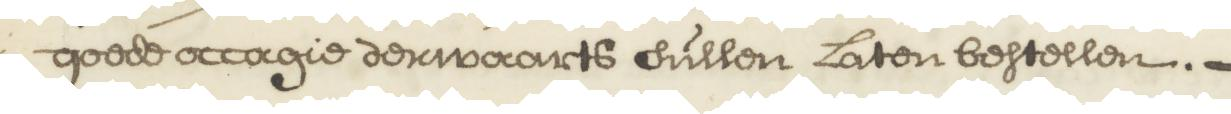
goede occagie derwaarts sullen laten bestellen.-
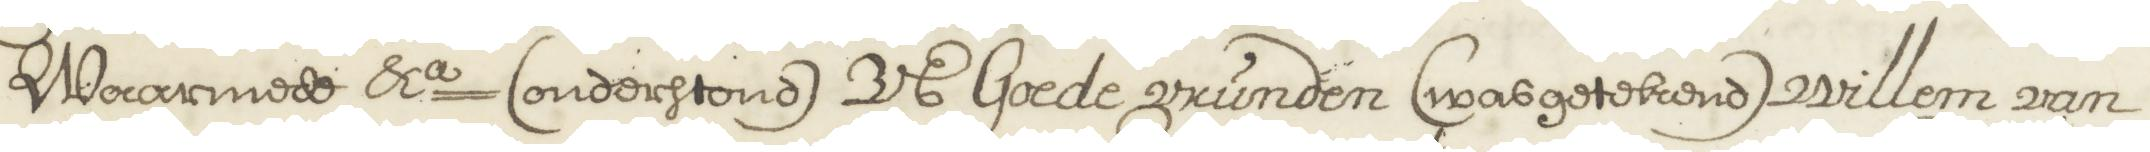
Waarmede &=a (onderstond) UE Goede vrunden (was getekend) Willem van
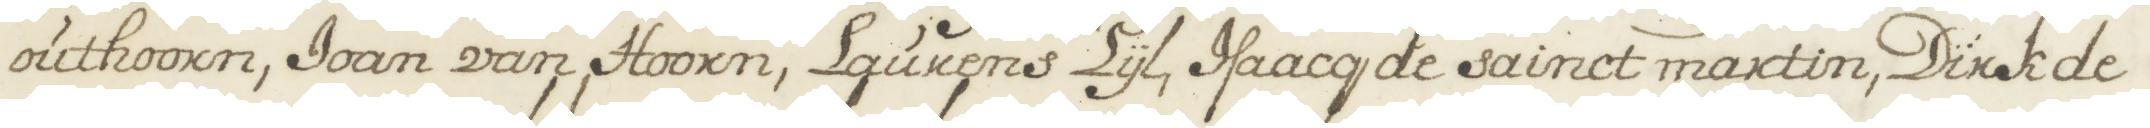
outhoorn, Joan van Hoorn, Laurens Pijl, Isaacq de sainct martin, Dirk de
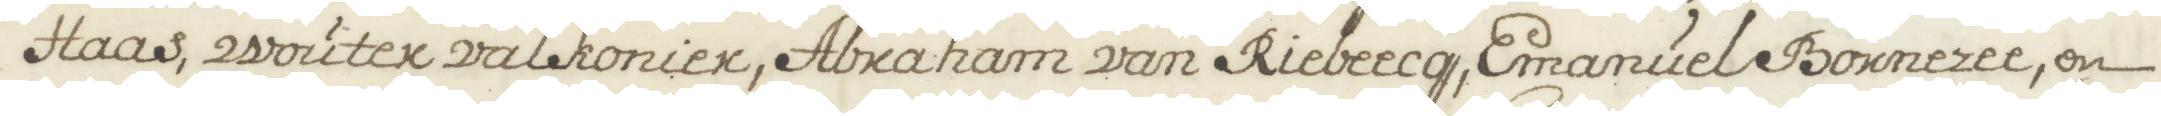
Haas, wouter valkonier, Abraham van Riebeecq, Emanuel Bornezee, en
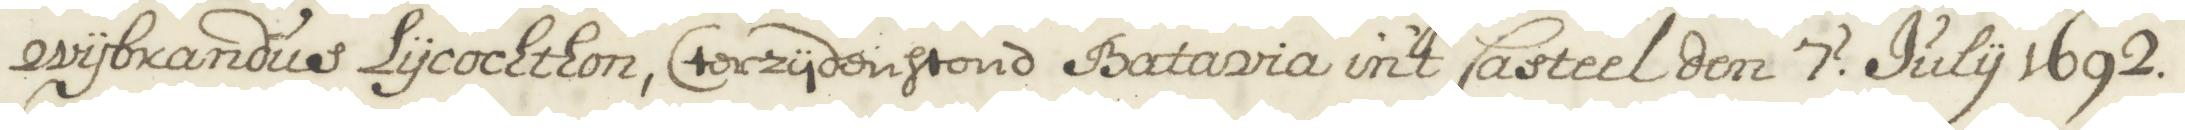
wijbrandus Lijcochthon, (ter zijden stond Batavia in ’t Casteel den 7'. Julij 1692.
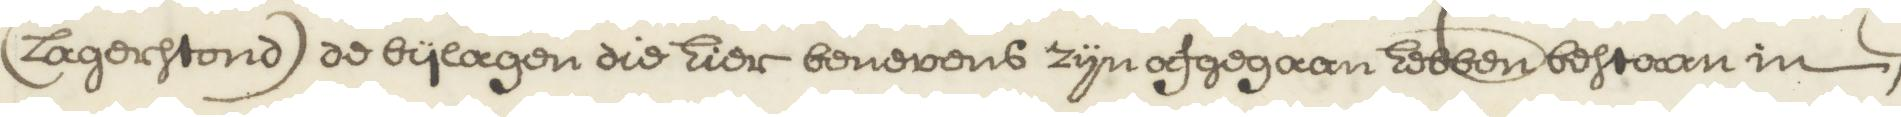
(Lager stond) de bijlagen die hier benevens zijn afgegaan hebben bestaan in,
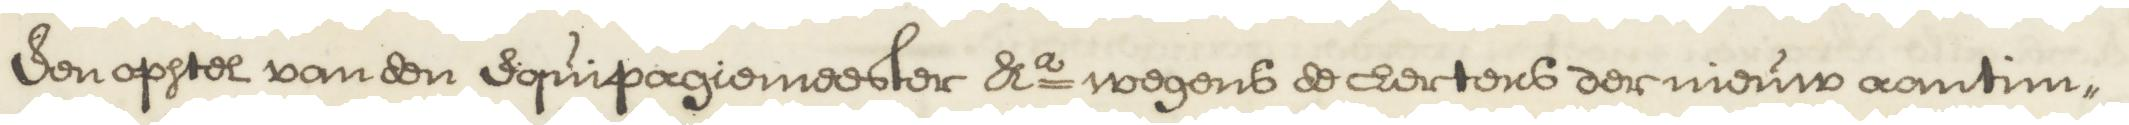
Een opstel van den Equipagiemeester &=a wegens de cherters der nieuw aan tim„
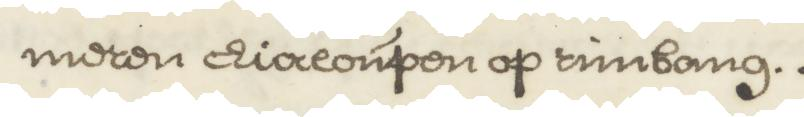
meren chialoupen op rimbang.
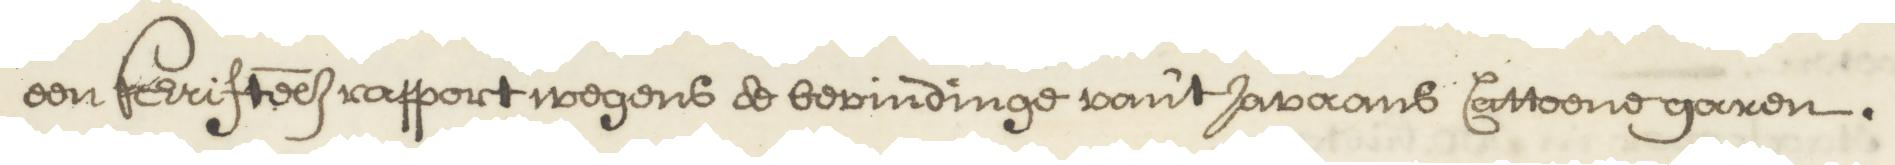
een schriftel: rapport wegens de bevindinge van ’t Javaans Cattoene garen.
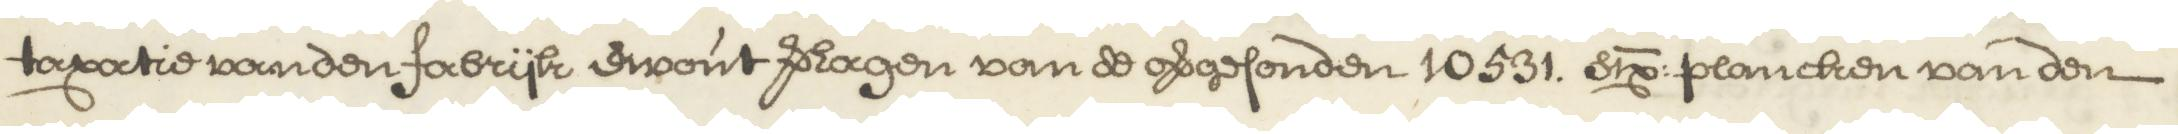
taxatie van den fabrijk Ewout Verhagen van de overgesonden 10531. stx: plancken van den
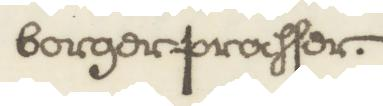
borger prasser.
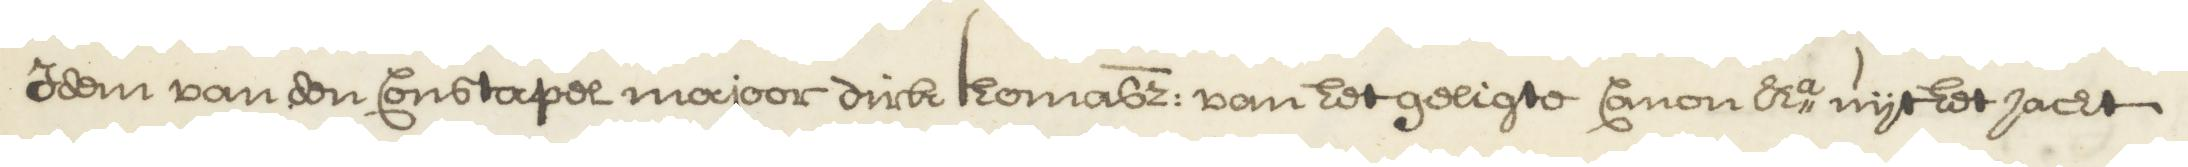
Idem van den Constapel majoor dirk thomasz: van het geligte Canon &„a uijt het jacht
